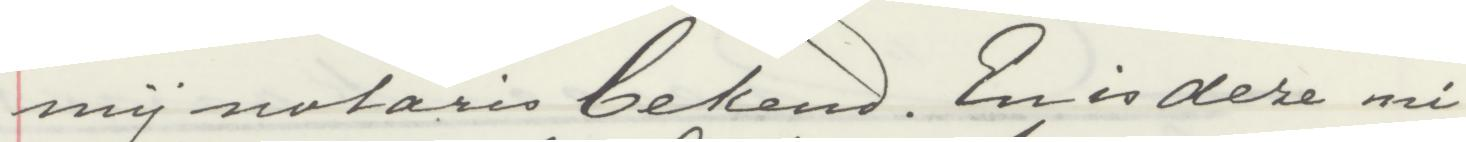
mij notaris bekend. En is deze mi
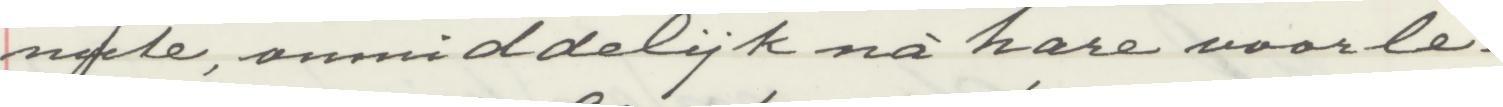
nute, onmiddelijk na hare voorle-
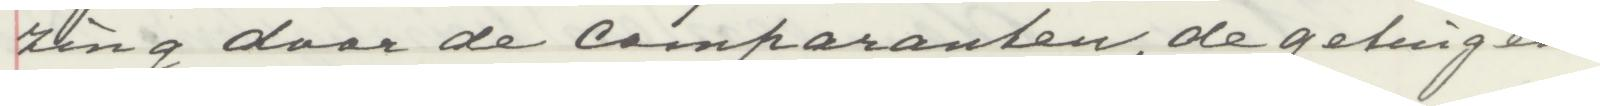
zing door de comparanten, de getuigen
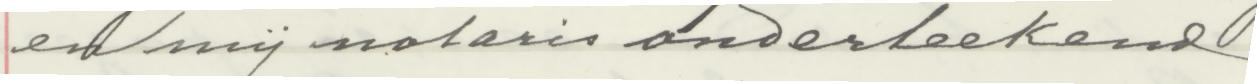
en mij notaris onderteekend
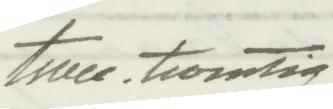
twee . twintig
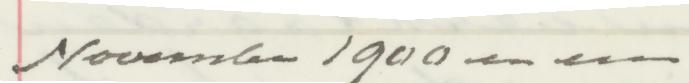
November 1900 en een
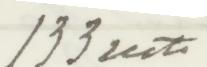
133 recto
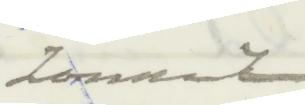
zonder
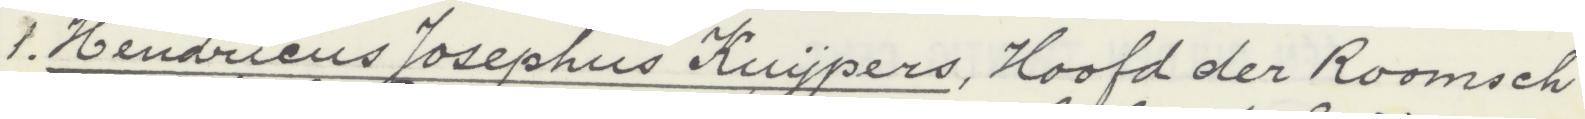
1. Hendricus Josephus Kuijpers, Hoofd der Roomsch
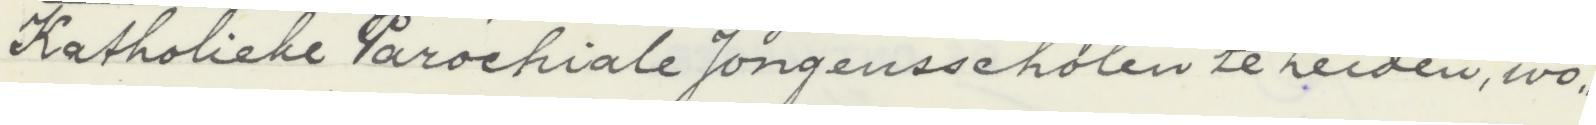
Katholieke Parochiale Jongensscholen te Leiden, wo„
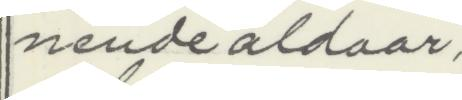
nende aldaar
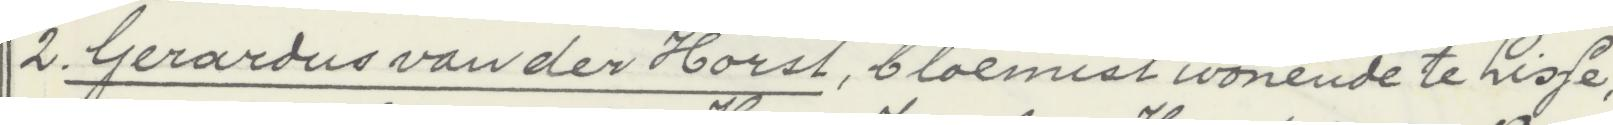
2. Gerardus van der Horst, bloemist wonende te Lisse,
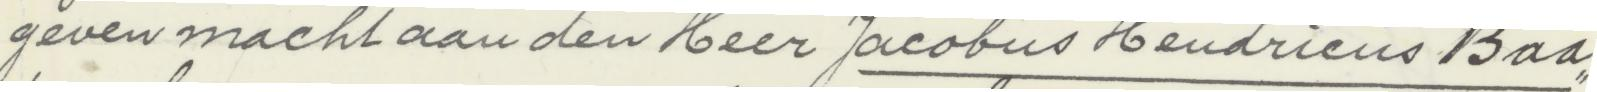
geven macht aan den Heer Jacobus Hendricus Baa„
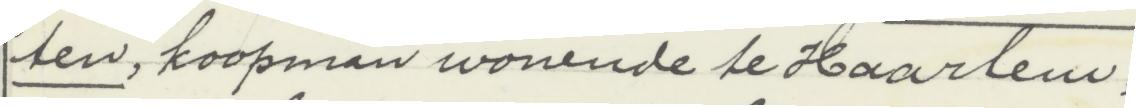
ten, koopman wonende te Haarlem
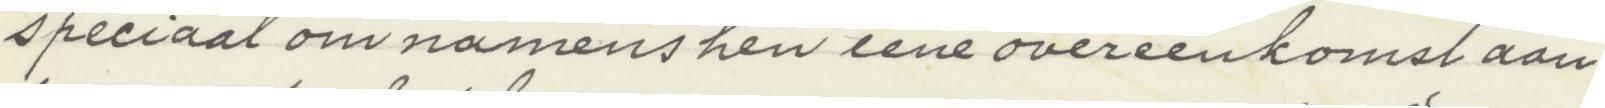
speciaal om namens hen eene overeenkomst aan
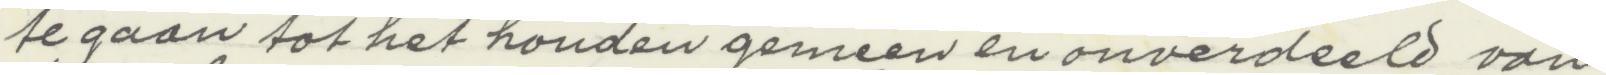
te gaan tot het houden gemeen en onverdeeld van
